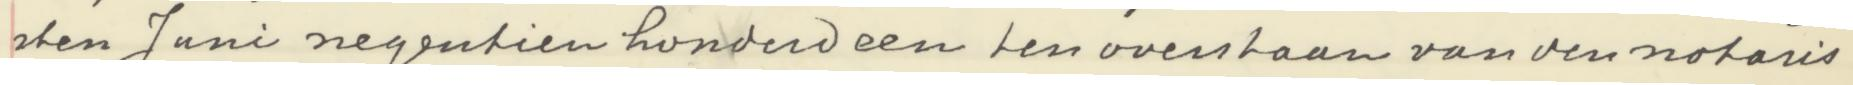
sten Juni negentien honderd een ten overstaan van den notaris
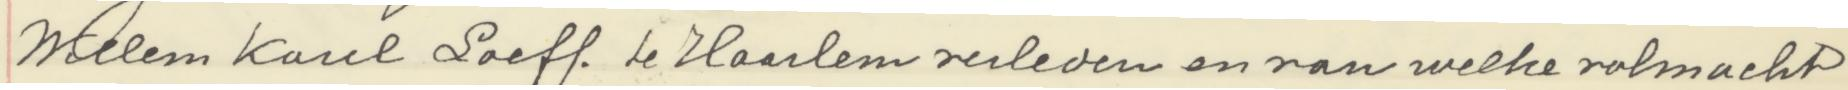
Willem Karel Loeff. te Haarlem verleden en van welke volmacht
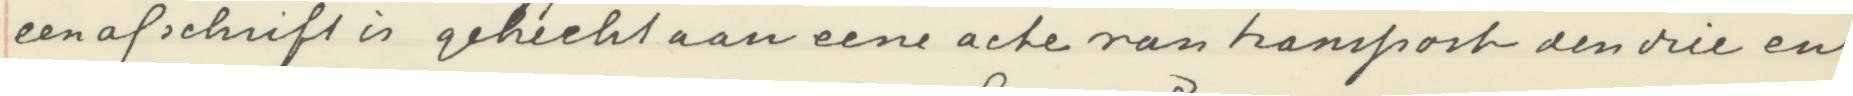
een afschrift is gehecht aan eene acte van transport den drie en
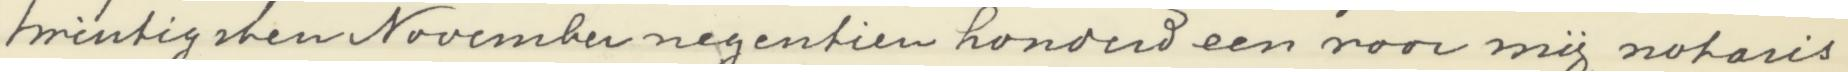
twintigsten November negentien honderd een voor mij notaris
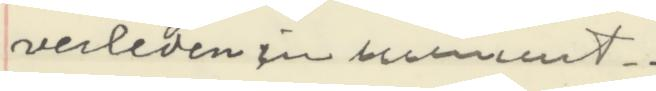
verleden in minuut-
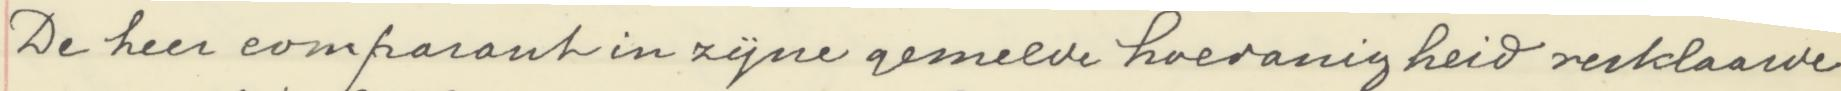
De heer comparant in zijne gemelde hoedanigheid verklaarde
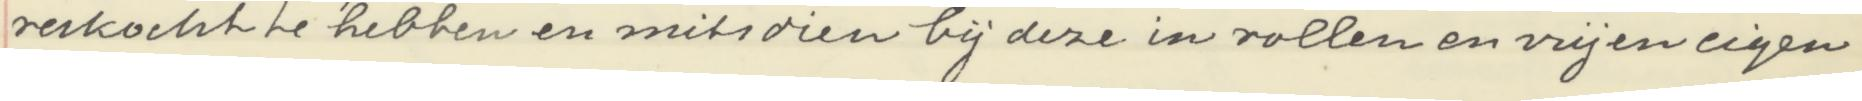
verkocht te hebben en mitsdien bij deze in vollen en vrijen eigen
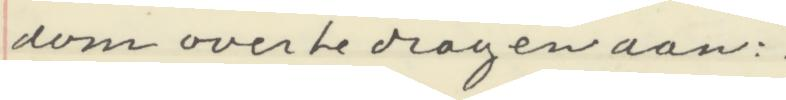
dom over te dragen aan:
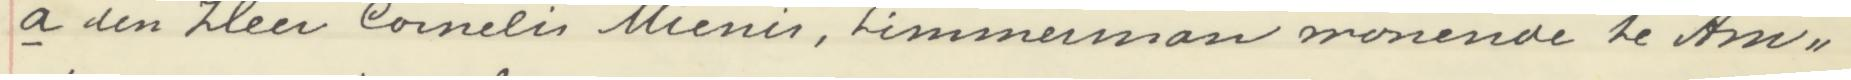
a den Heer Cornelis Mienis, timmerman wonende te Am„
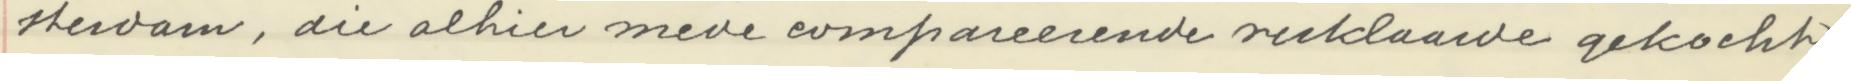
sterdam, die alhier mede compareerende verklaarde gekocht
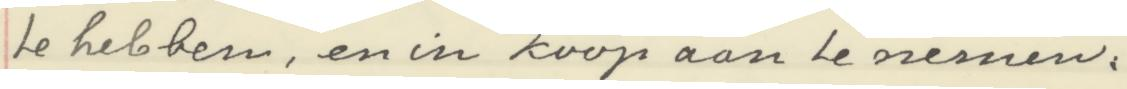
te hebben, en in koop aan te nemen:
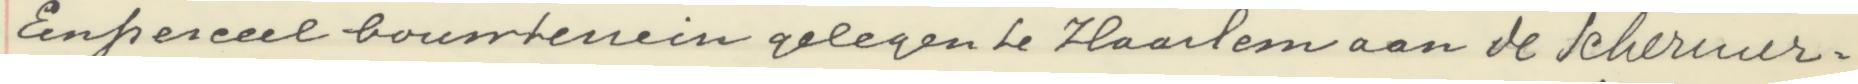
Een perceel bouwterrein gelegen te Haarlem aan de schermer=
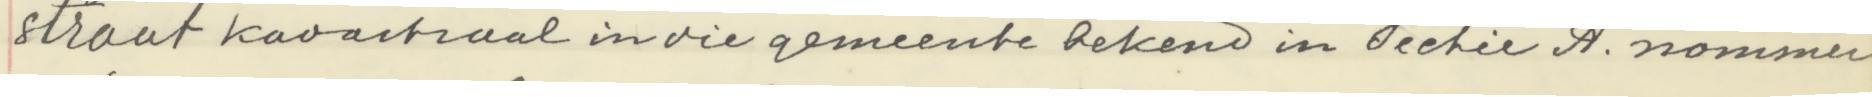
straat kadastraal in die gemeente bekend in sectie A. nommer
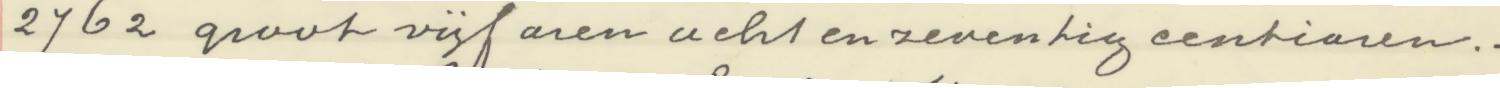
2762 groot vijf aren acht en zeventign centiaren.
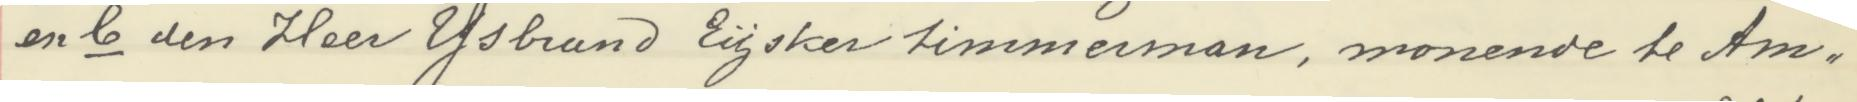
en b den Heer Ysbrand Eijsker timmerman, wonende te Am„
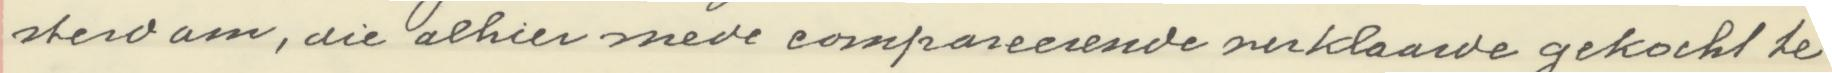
sterdam, die alhier mede compareerende verklaarde gekocht te
